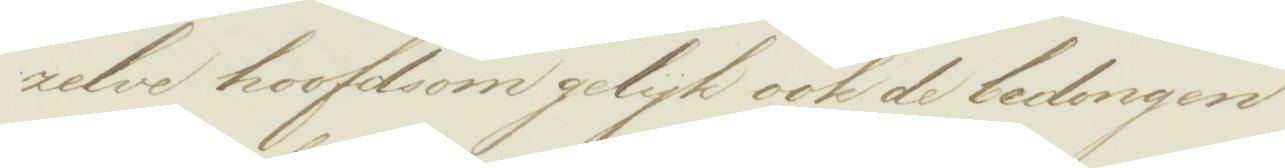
zelve hoofdsom gelijk ook de bedingen
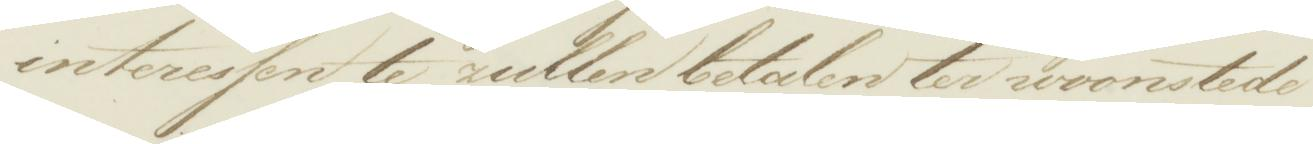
interessen te zullen betalen ter woonstede
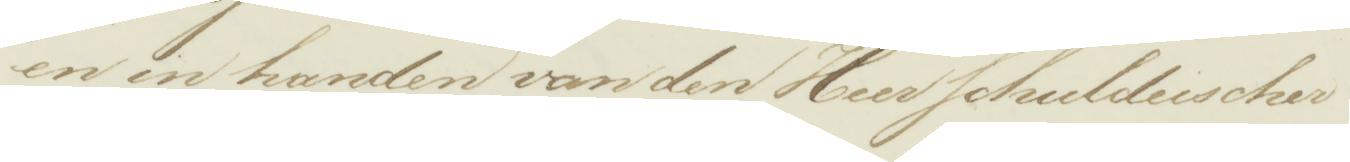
en in handen van den Heer schuldeischer
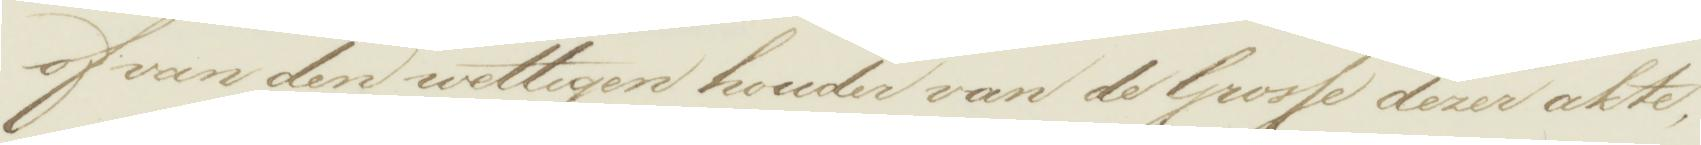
of van den wettigen houder van de Grosse dezer akte,
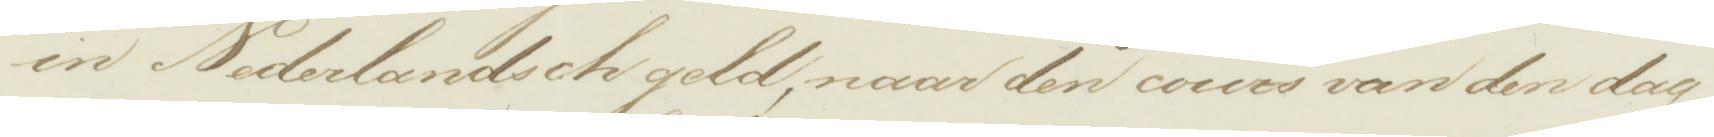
in Nederlandsch geld, naar den cours van den dag
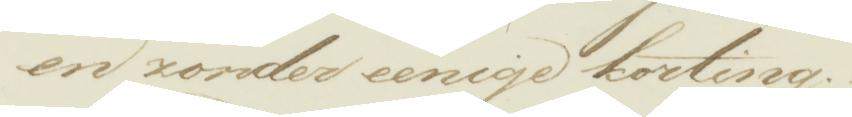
en zonder eenige korting.
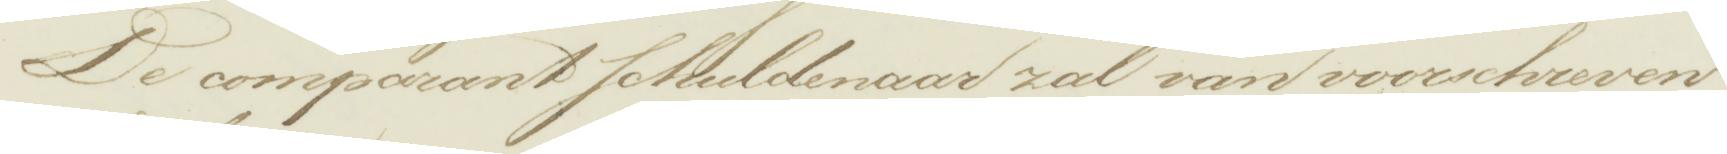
De comparant schuldenaar zal van voorschreven
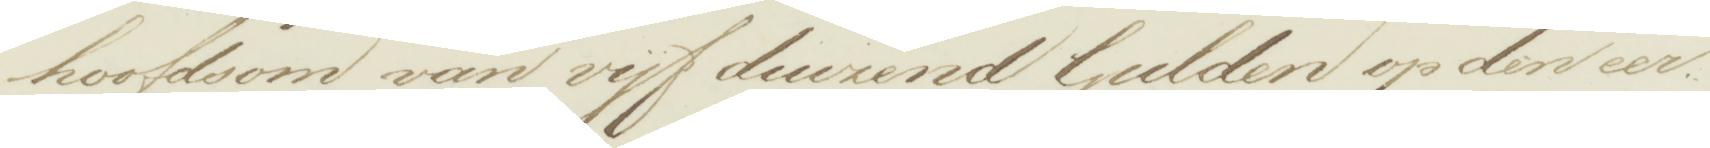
hoofdsom van vijf duizend Gulden op den eer.
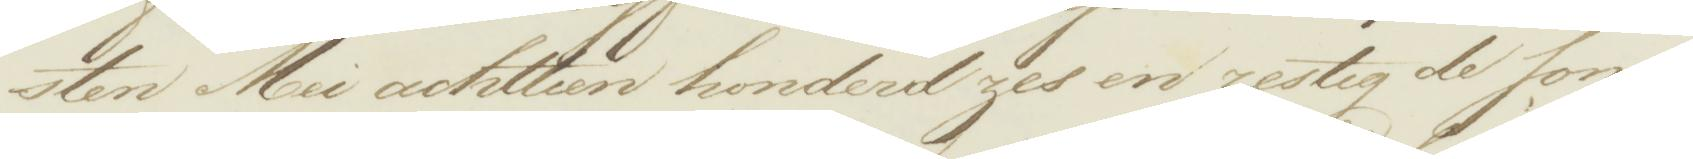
sten Mei achttien honderd zes en zestig de Som
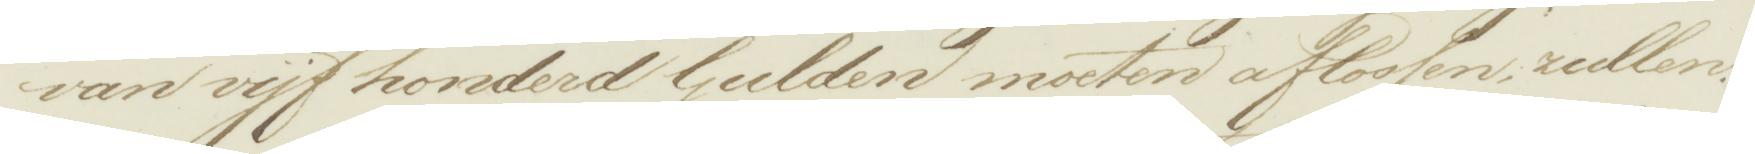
van vijf honderd Gulden moeten aflossen, zullen.
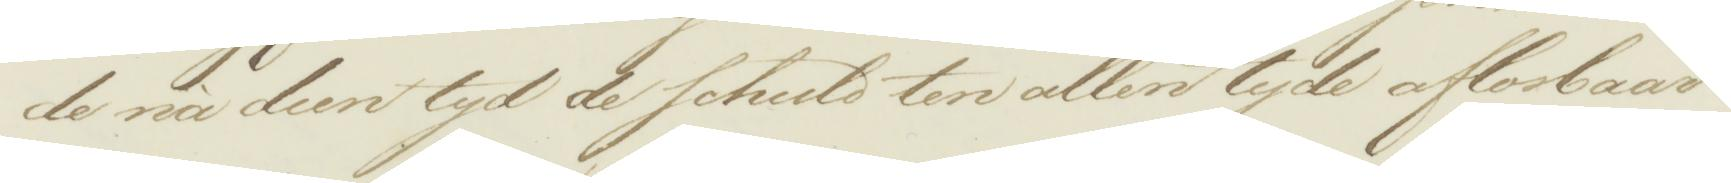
de na dien tyd de schuld ten allen tyde aflosbaar
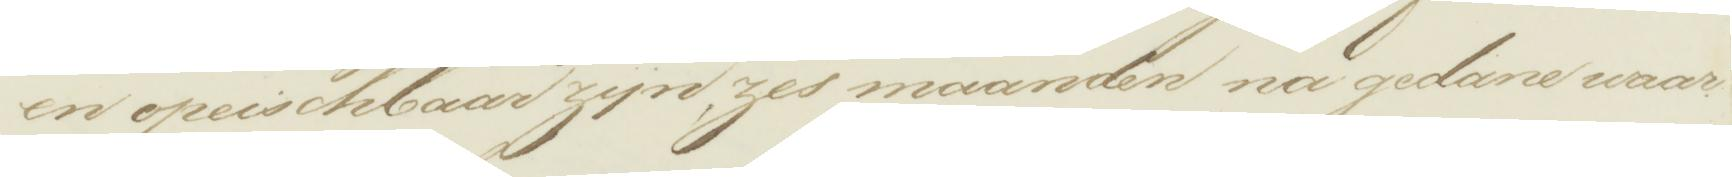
en opeischbaar zijn zes maanden na gedane waar„
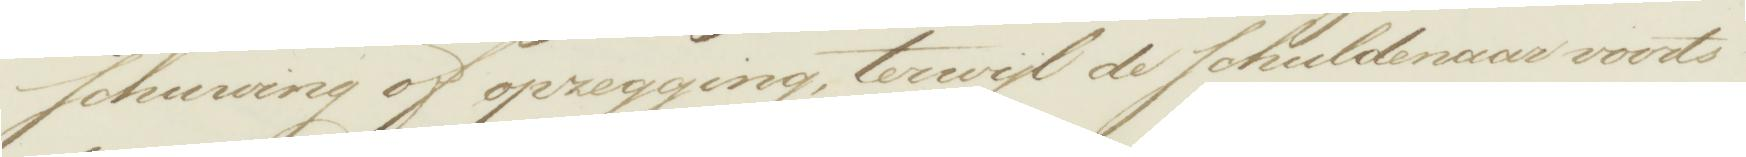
schuwing of opzegging, terwijl de schuldenaar voorts
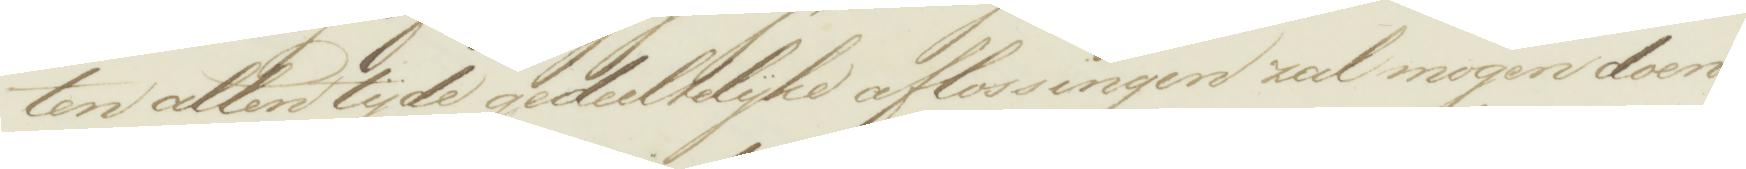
ten allen tijde gedeeltelijke aflossingen zal mogen doen
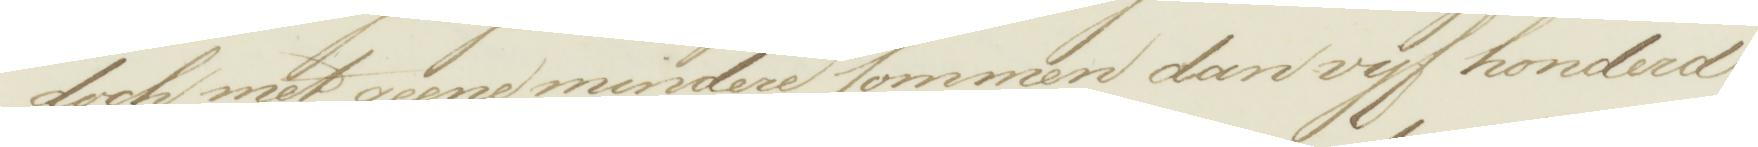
doch met geene mindere sommen dan vyf honderd
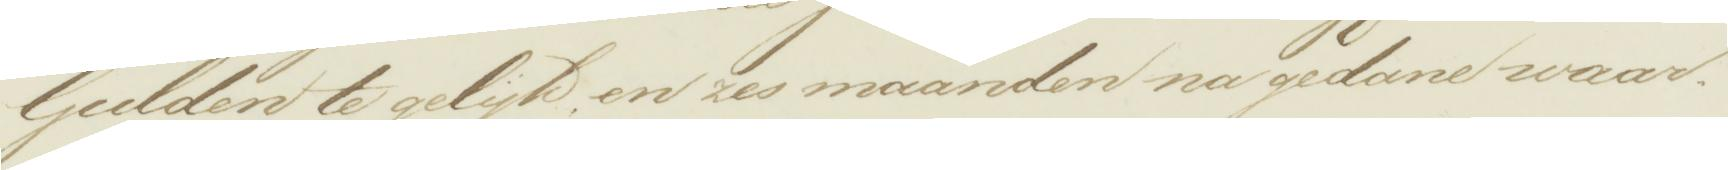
Gulden te gelijk, en zes maanden na gedane waar„
